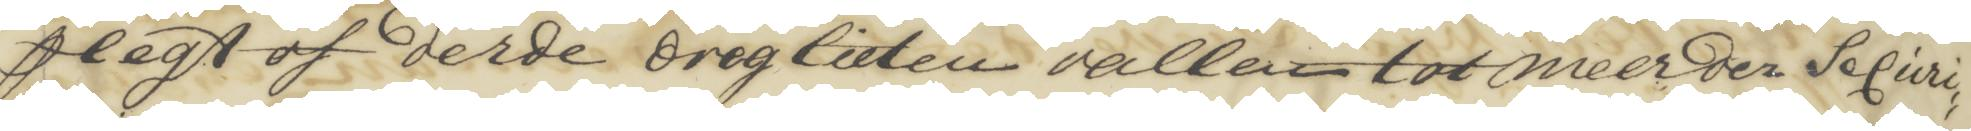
plegt of derde dreg lieten vallen tot meerder securi„
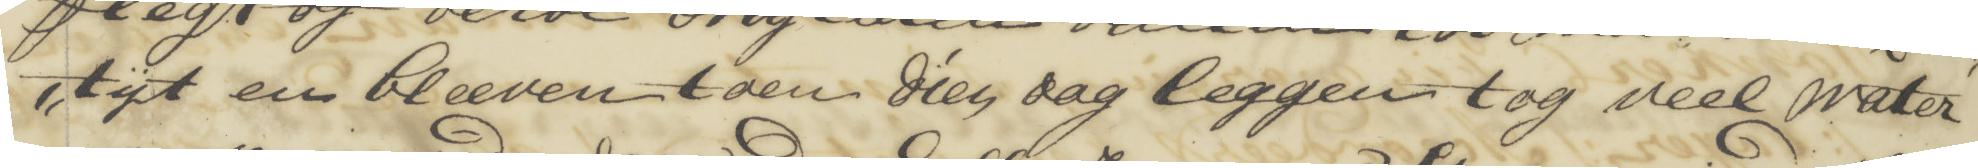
„tijt en bleeven toen dien dag leggen tog veel water
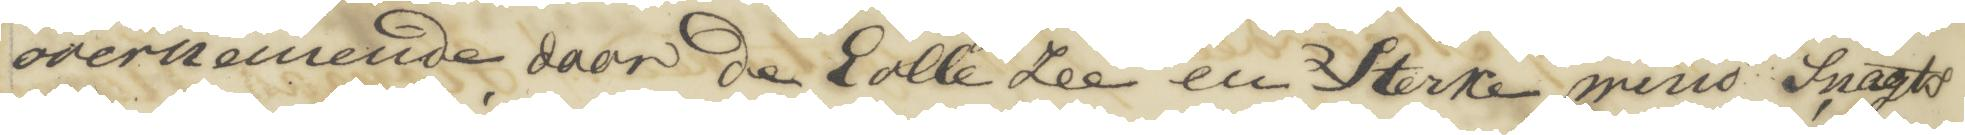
overnemende door de holle zee en sterke wind snagts
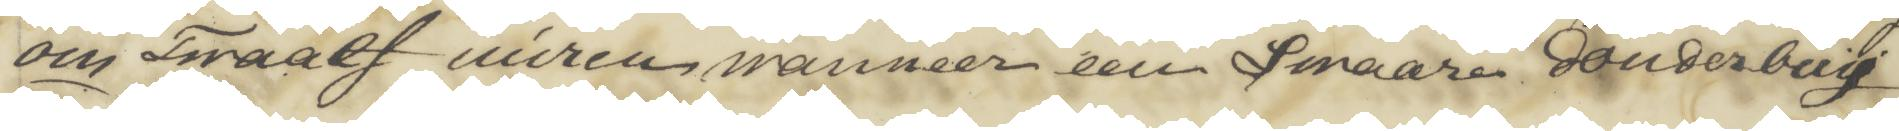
om Twaalf uuren wanneer een swaare donderbuij
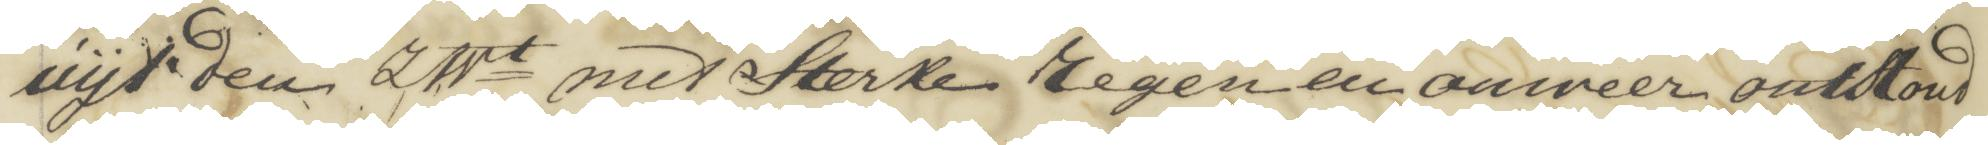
uijt den ZW=t met sterke regen en onweer ontstond
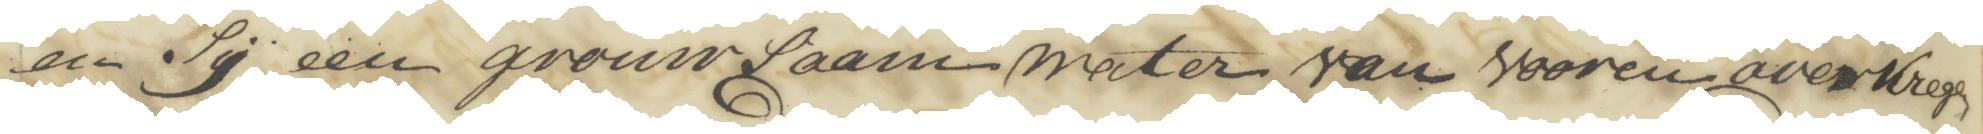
en sij een grouwsaam water van vooren overkregen
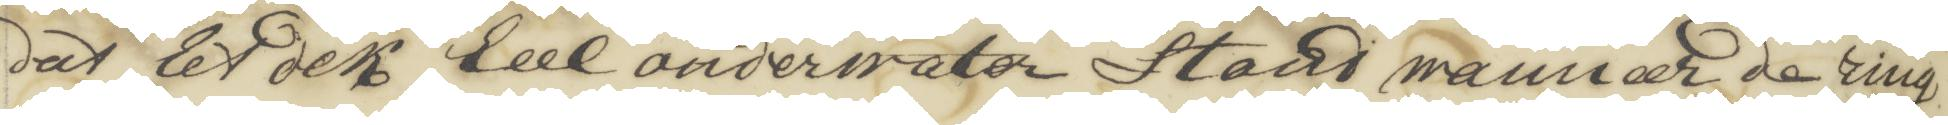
dat het dek heel onderwater stond wanneer de ring
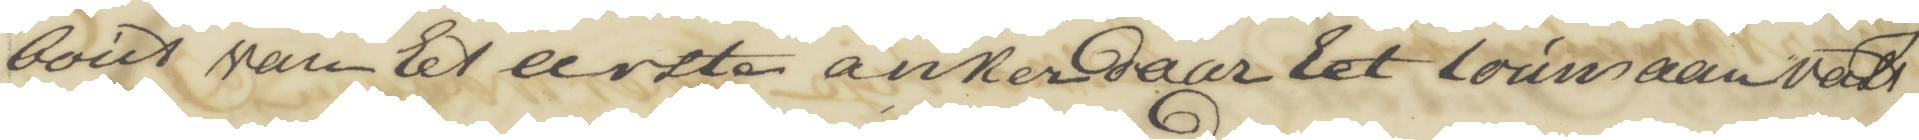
bout van het eerste anker daar het touw aan vast
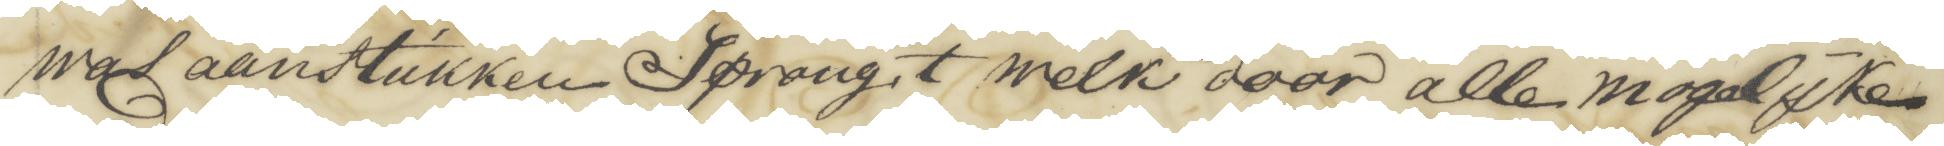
was aanstukken sprong, 't welk door alle mogelijke
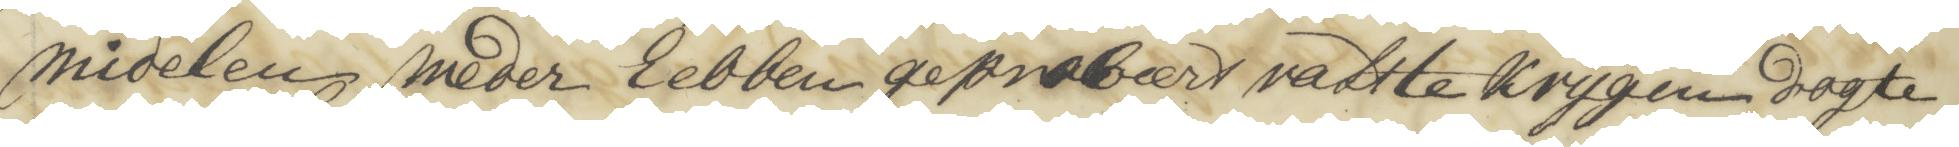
midelen weder hebben geprobeert vast te krijgen dog te
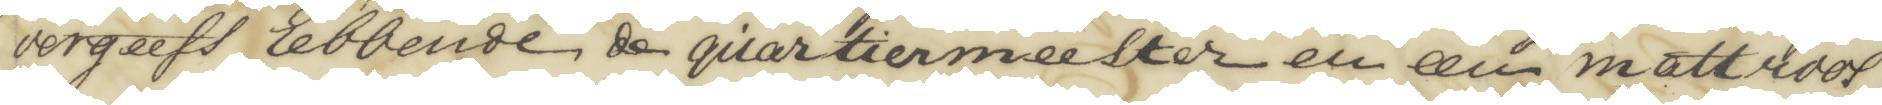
vergeefs hebbende de quartiermeester en een mattroos
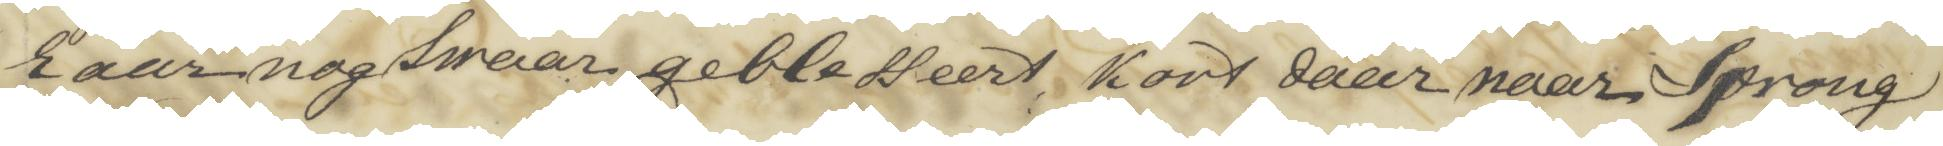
haar nog swaar geblesseert, kort daar naar sprong
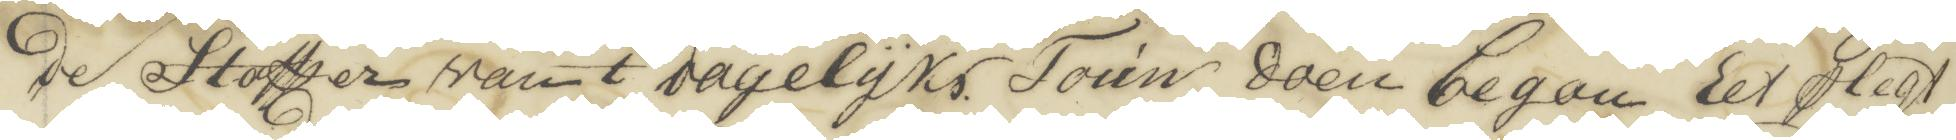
de stopper van’t dagelijks Touw doen begon het plegt
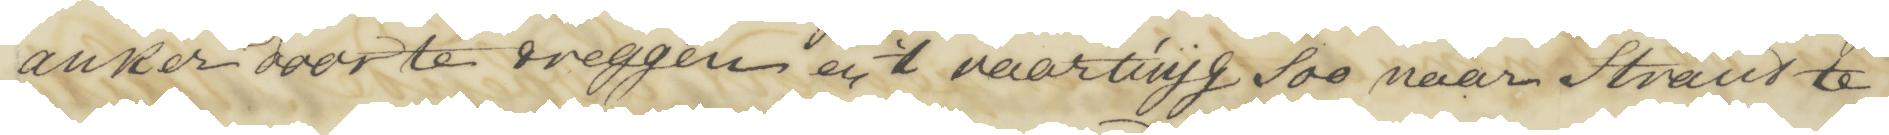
anker door te dreggen en ’t vaartuijg soo naar strant te
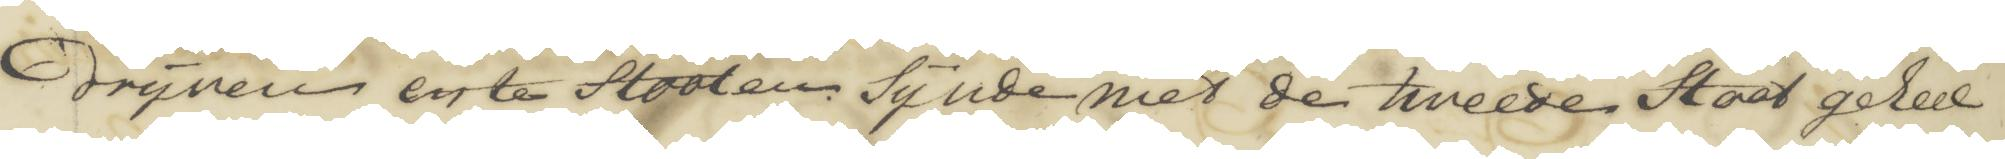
drijven en te stooten sijnde met de tweede stoot geheel
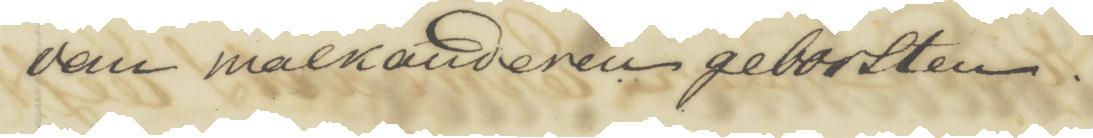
van malkanderen geborsten.
